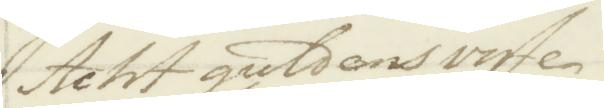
Acht guldens vyf en
